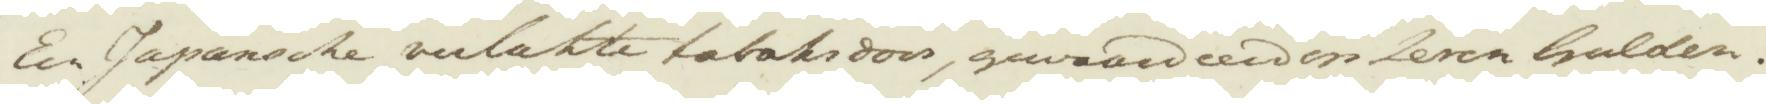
Een Japansche verlakte tabaksdoos, gewaardeerd op Zeven Gulden
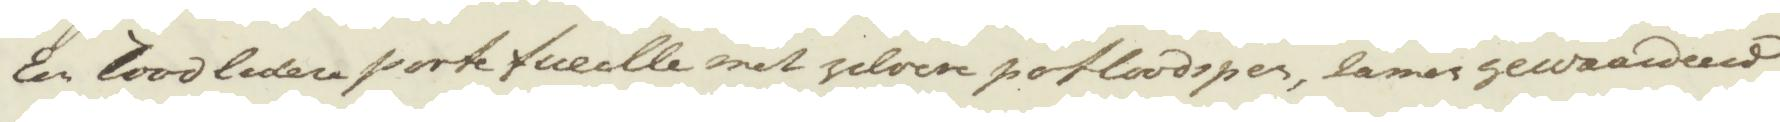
Een rood leder portefueille met zilvere potloodspen, zamen gewaardeerd
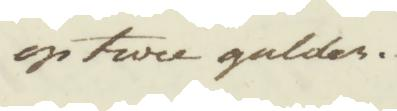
op twee gulden.
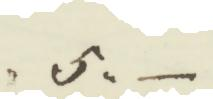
„ 5„ —
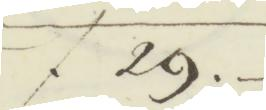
ƒ 29.
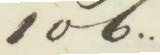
106„
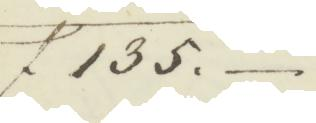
ƒ 135. —
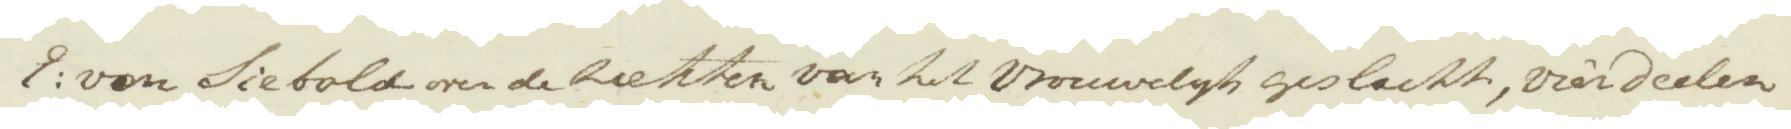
E: van Siebold over de ziekten van het vrouwelijk geslacht, vier deelen
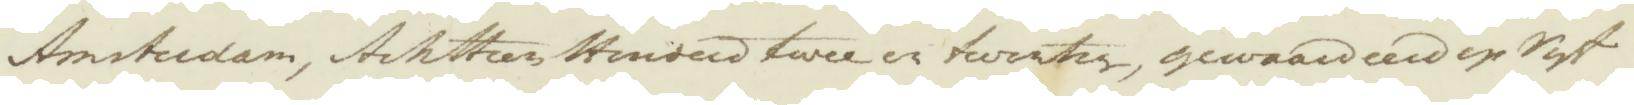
Amsterdam, Achttien Honderd twee en twintig, gewaardeerd op Vyf
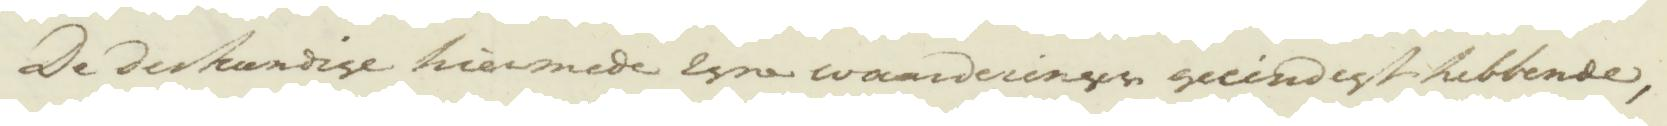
De deskundige hiermede zyne waarderingen geeindigt hebbende,
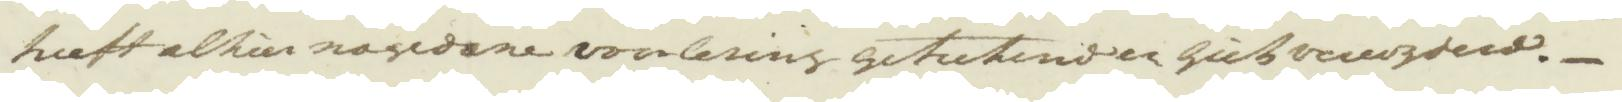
heeft alhier nagedene voorlezing getekend en zich verwyderd. —
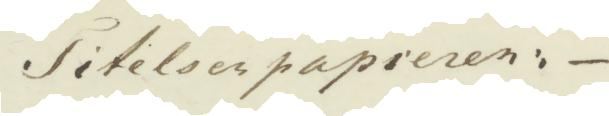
Titels en papieren: —
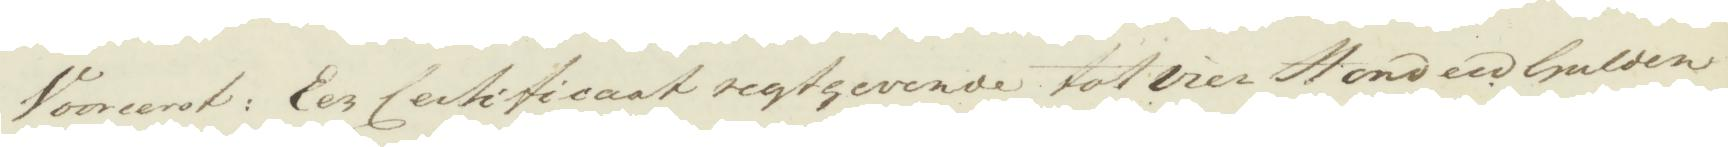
Vooreerst: Een Certificaat regtgevende tot vier Honderd Gulden
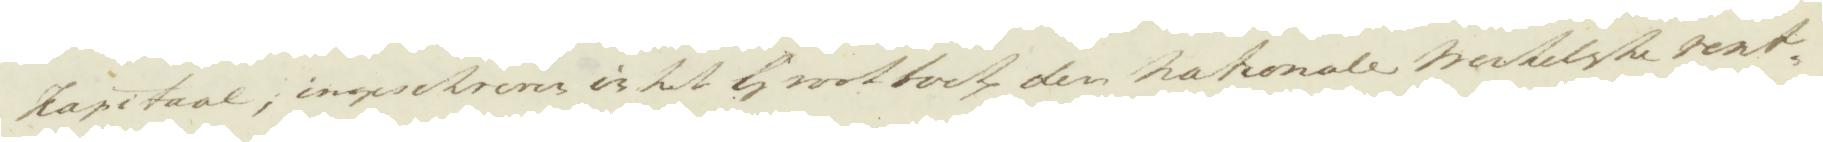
kapitaal, ingeschreven in het Grootboek der nationale Werkelyke rent„
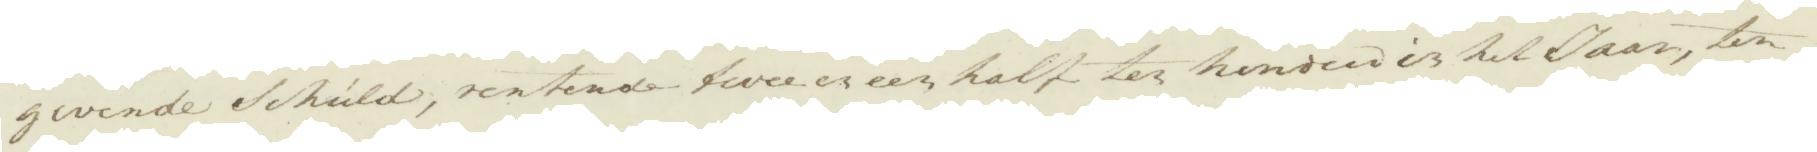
gevende schuld, rentende twee en een half ten honderd in het Jaar, ten
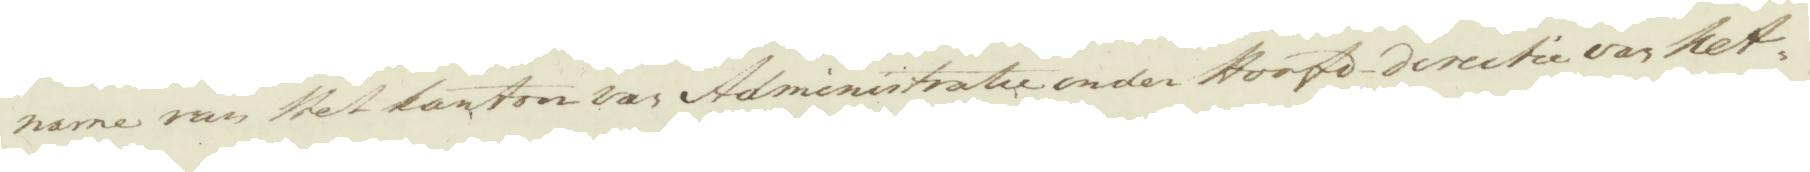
name van Het kanton van Administratie onder Hoofd=directie van ket„
